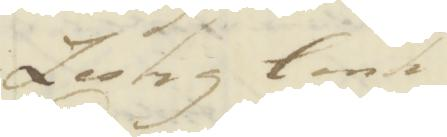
Zestig Cent
